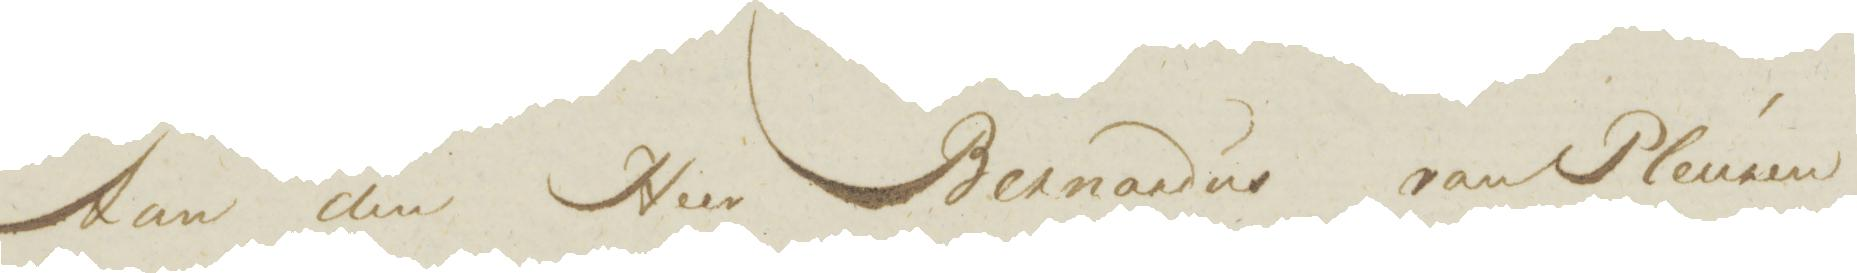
Aan den Heer Bernardus van Pleuren
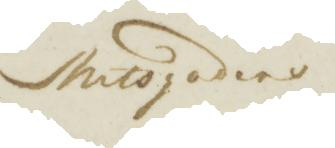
Mitsgaders
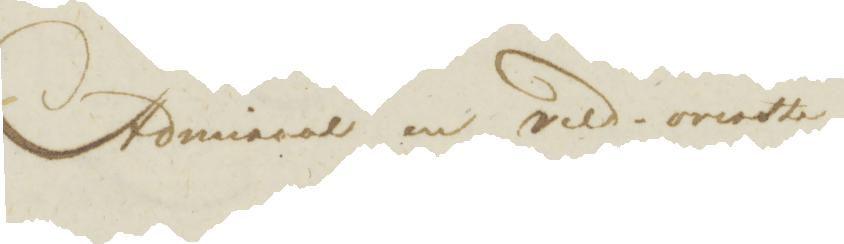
Admiraal en veld-overste
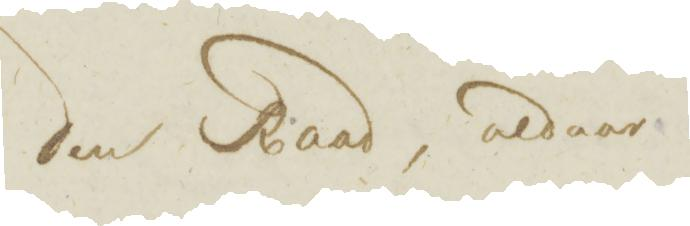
den Raad, aldaar
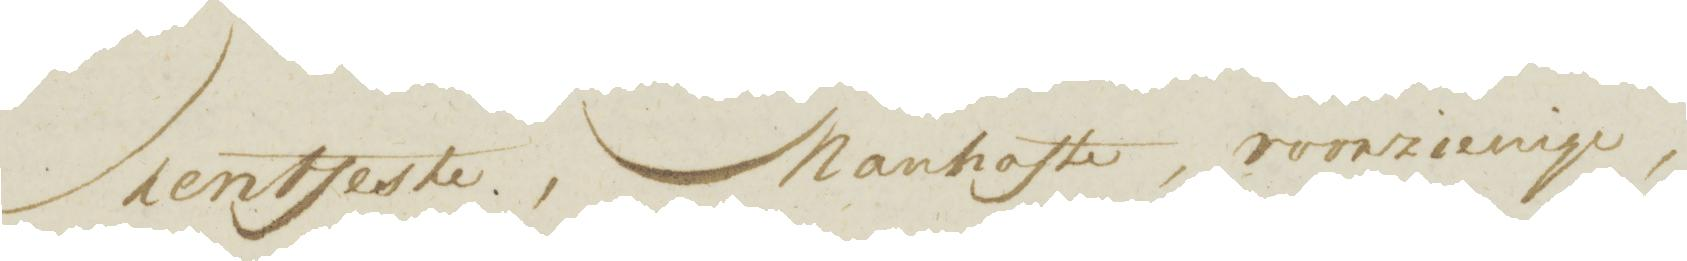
Erentfeste., Manhafte, voorzienige,
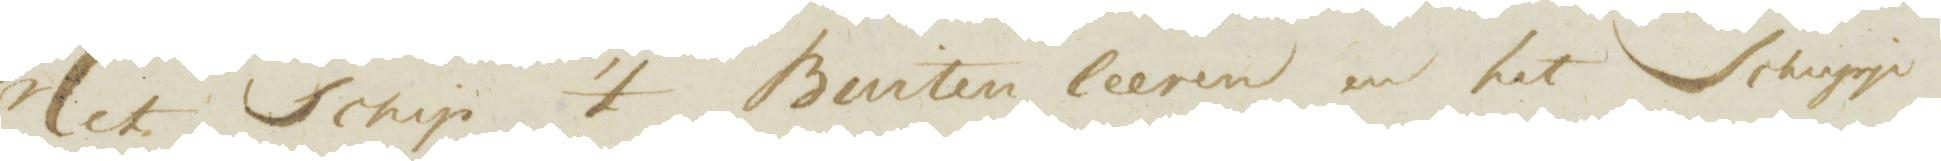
Het schip ’t Buiten leeven en het scheepje
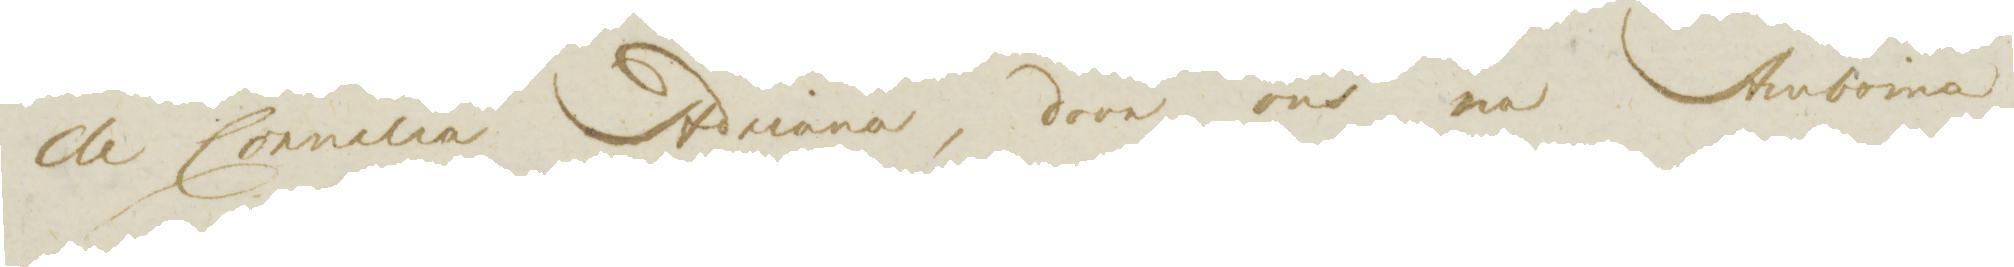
de Cornelia Adriana, door ons na Amboina
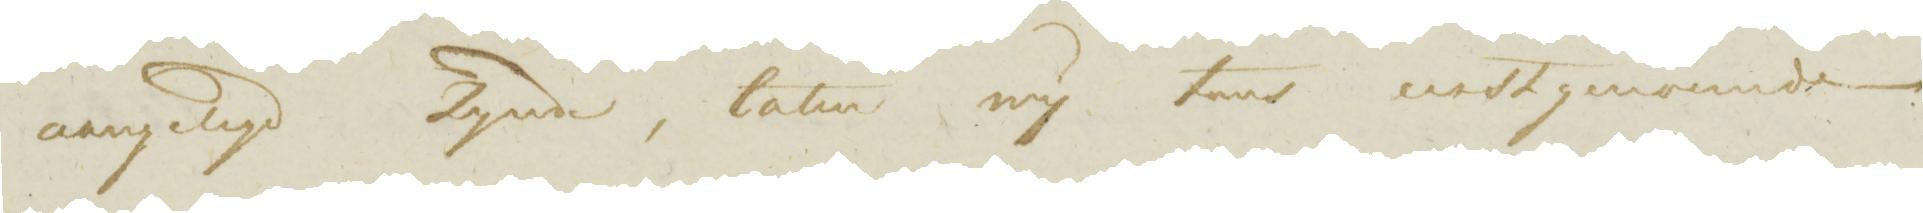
aangelegd zynde , laten wij tans eerstgenoemden
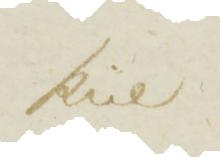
krie
